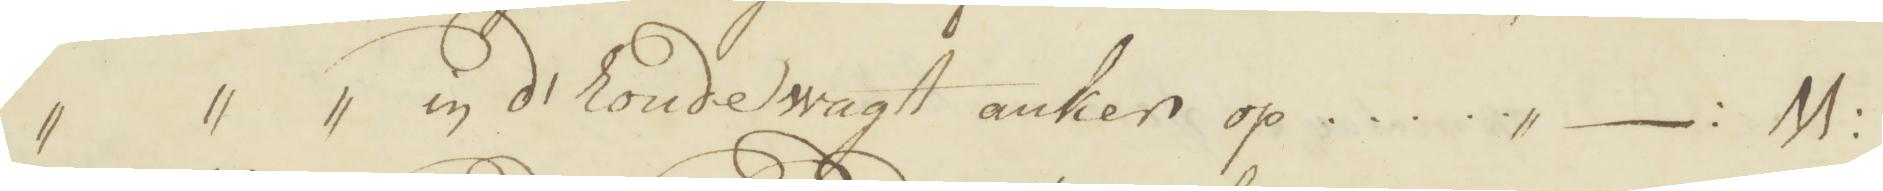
„ „ „ in d'hondewagt anker op - - - - - „ —: 11:
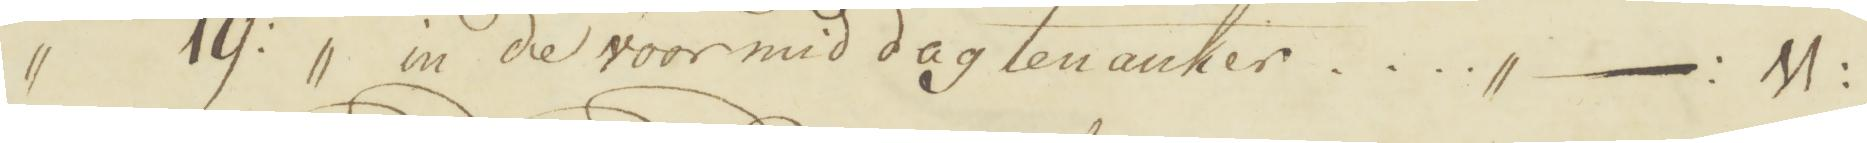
„ 19: „ in de voormiddag ten anker - - - - „ —: 11:
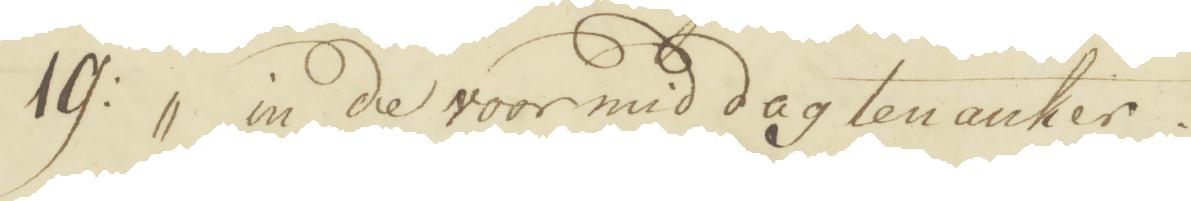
19: „ in de voor middag ten anker.
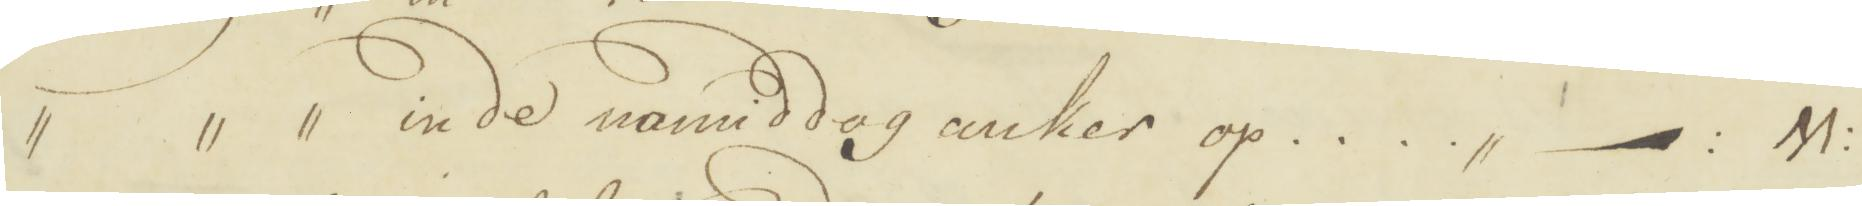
„ „ „ in de namiddag anker op - - - - „ —: 11:
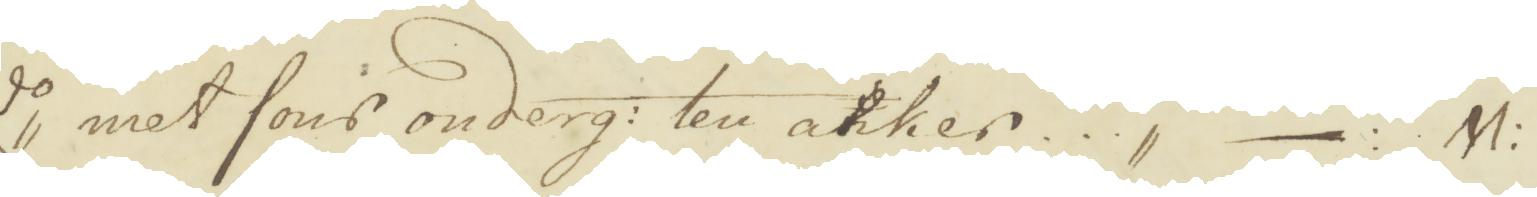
d„o met sons onderg: ten anker - - - „—: 11:
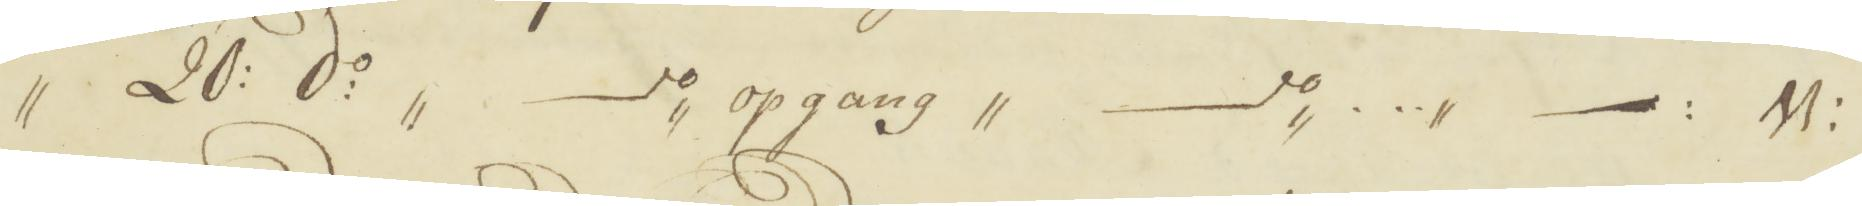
„ 20: d:o „ d„o op gang „ d„o - - - - „ —: 11:
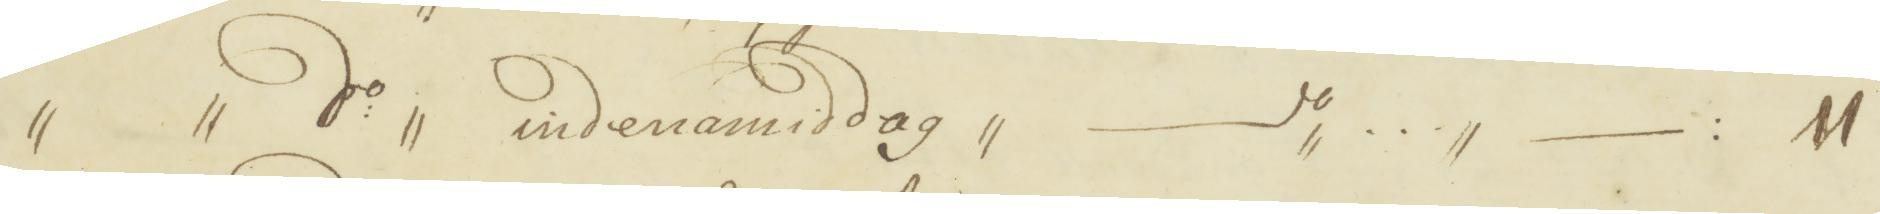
„ „ d:o „ ind namiddag „ d„o - - - - „ —: 11
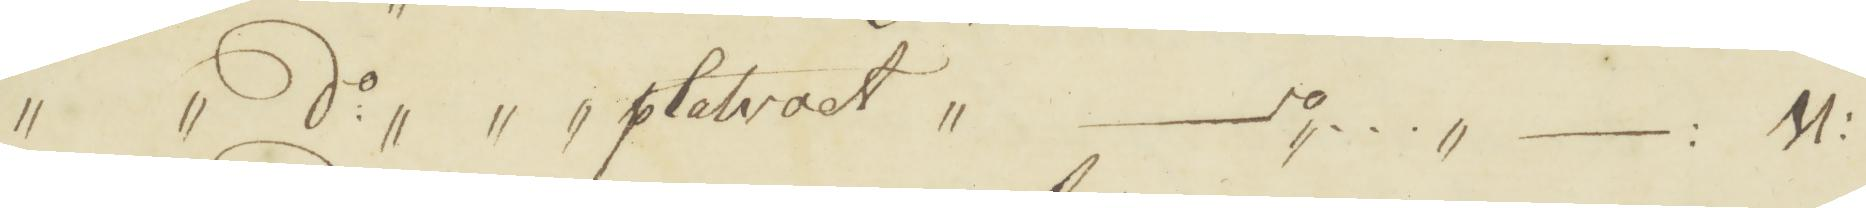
„ „ do: „ „ „ platvoet „ d„o „ - - - - „ —: 11:
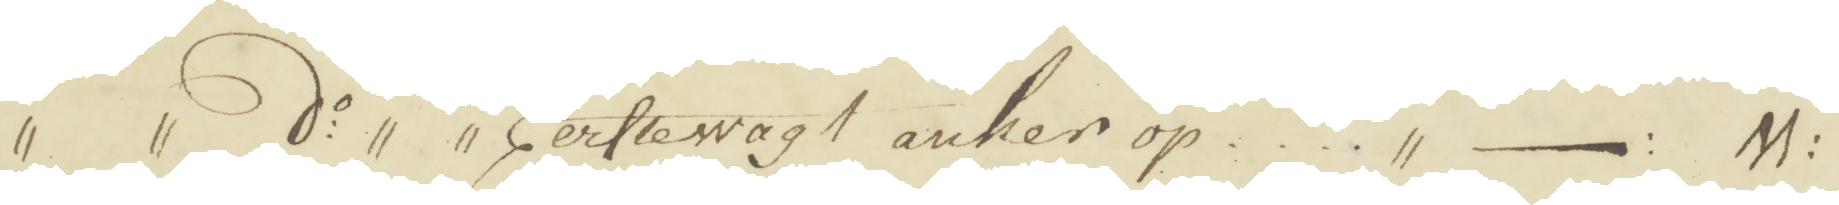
„ „ d:o „ „ Eerstewagt anker op - - - - „ —: 11:
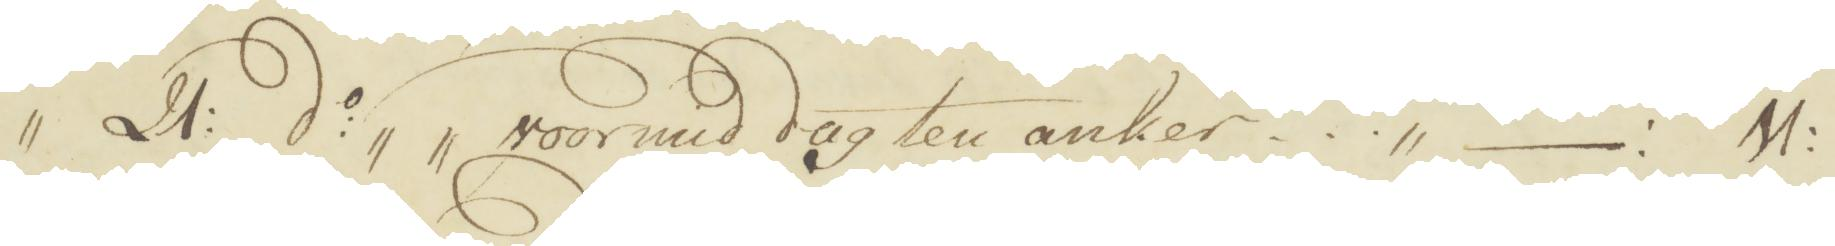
„ 21: d:o „ „ voormid dag ten anker - - - „ —: 11:
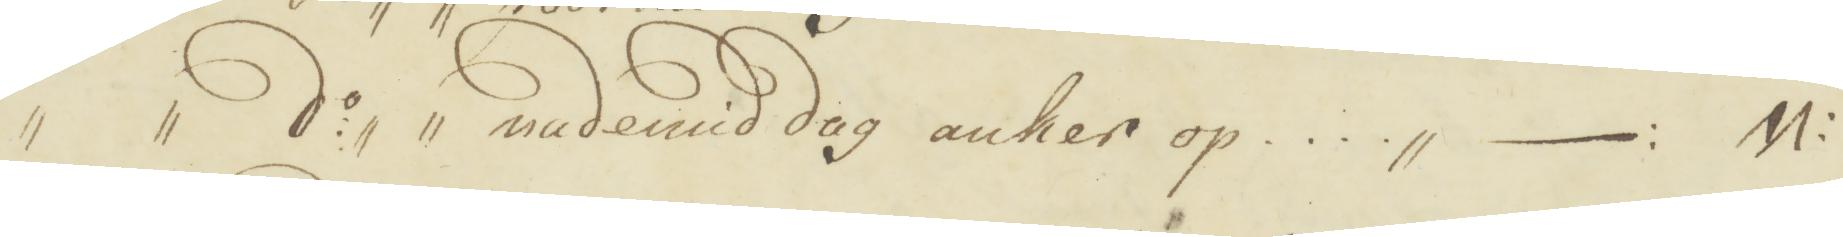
„ „ d:o „ „ nademid dag anker op - - - - „ —: 11:
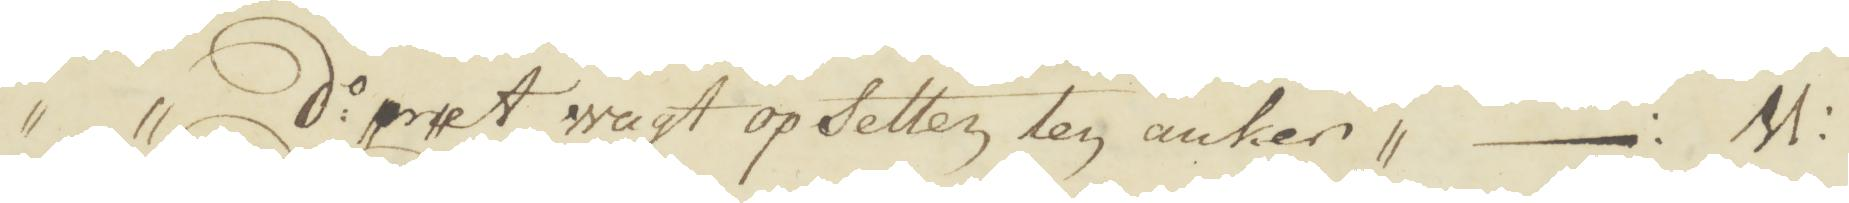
„ „ d:o met wagt opsetten ten anker „ —: 11:
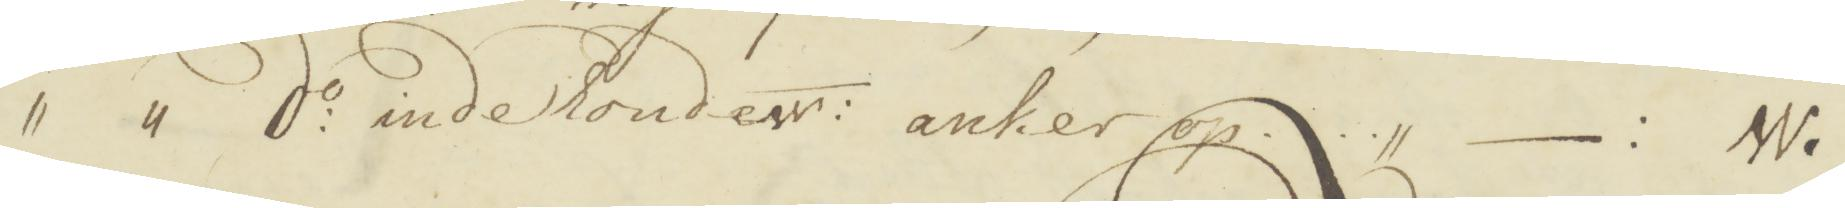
„ „ d:o in de hondew: anker op - - - - „ — : 11:
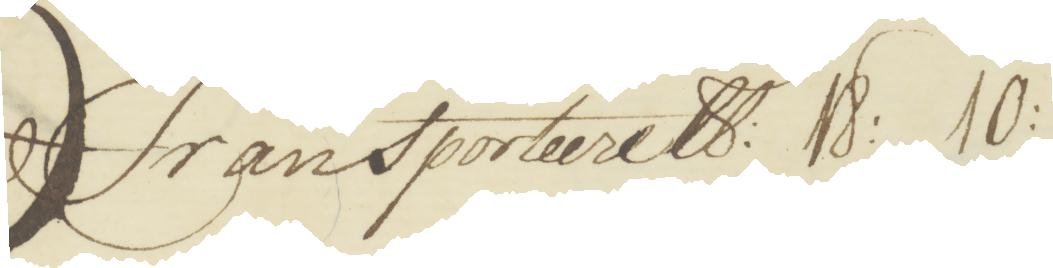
Transporteere lb: 18: 10:
